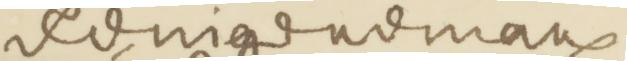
Eenige remar
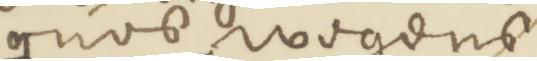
ques wegens
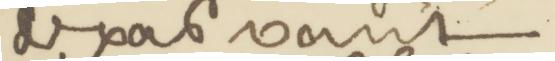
de pas van't
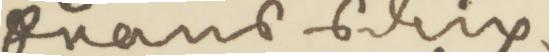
frans schip
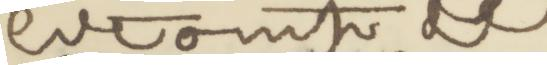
lecomte de
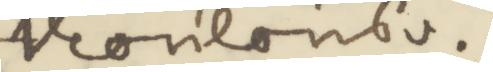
thoulouse.
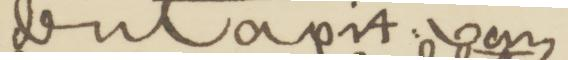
den Capit: van
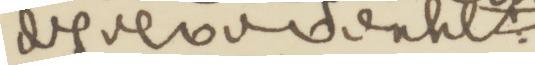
deselve verkl:t
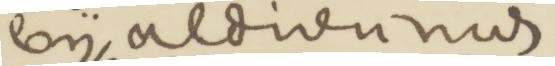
bij aldien men
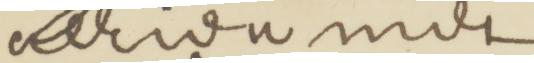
alhier niet
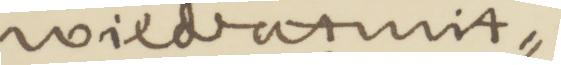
wilde atmit„
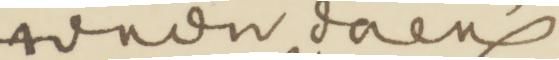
teren daer
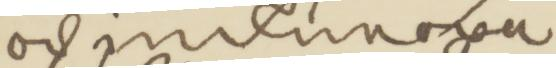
over in Europa
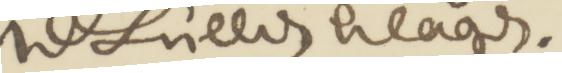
te sullen klagen.
